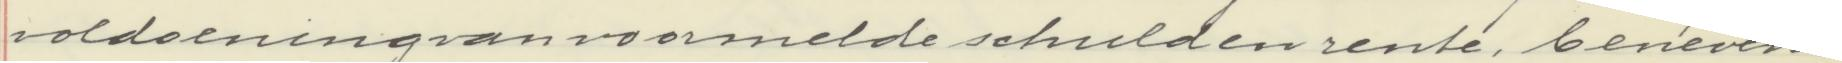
voldoening van voormelde schuld en rente, benevens
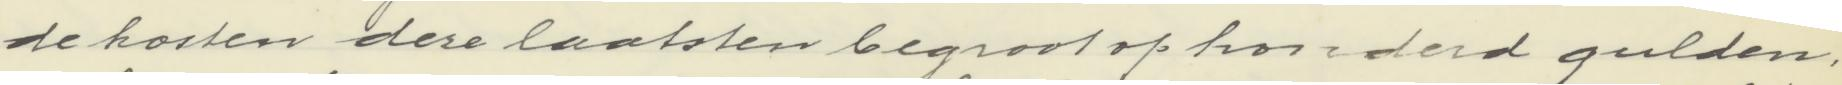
de kosten deze laatsten begroot op honderd gulden
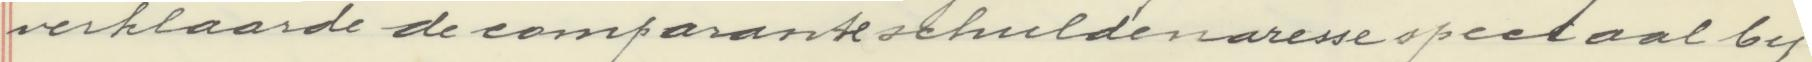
verklaarde de comparante schuldenaresse speciaal bij
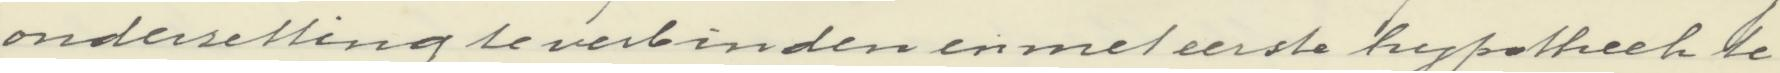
onderzetting te verbinden en met eerste hypotheek te
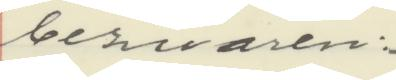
bezwaren
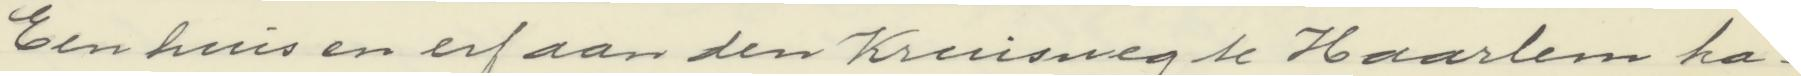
Een huis en erf aan den Kruisweg te Haarlem ka-
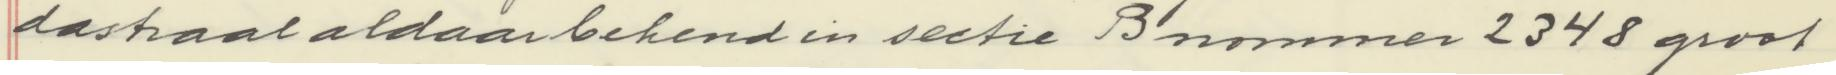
dastraal aldaar bekend in sectie B nommer 2348 groot
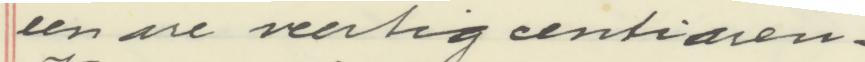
een are veertig centiaren
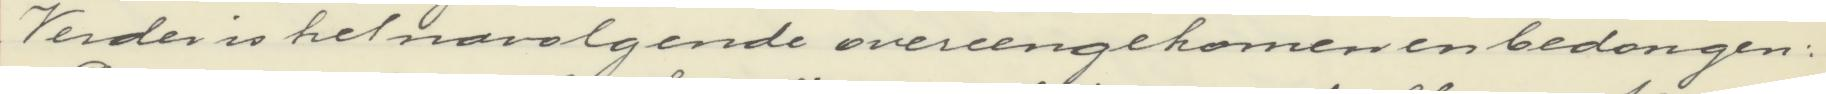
Verder is het navolgende overeengekomen en bedongen:
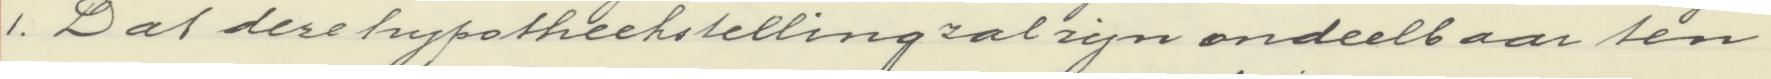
1. Dat deze hypotheekstelling zal zyn ondeelbaar ten
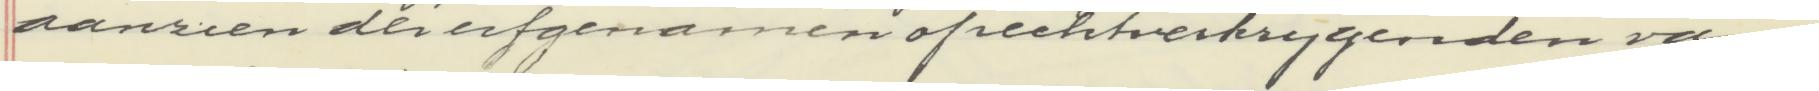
aanzien der erfgenamen of rechtverkrijgenden van
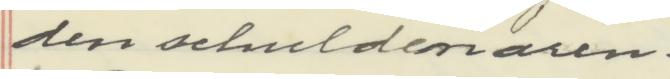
den schuldenaren
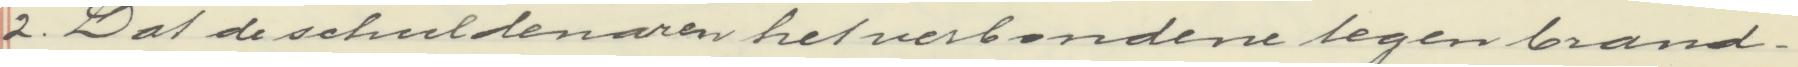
2. Dat de schuldenaren het verbondene tegen brand-
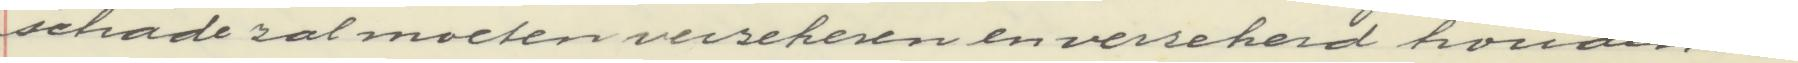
schade zal moeten verzekeren en verzekerd houden in
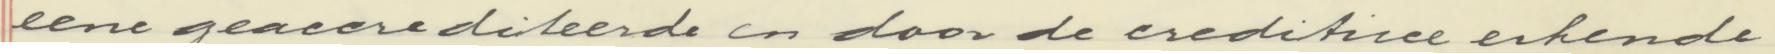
eene geaccrediteerde en door de creditrice erkende
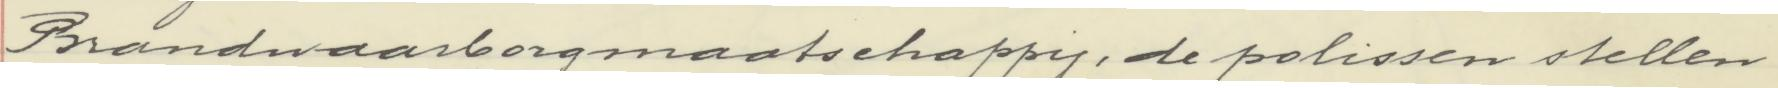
Brandwaarborgmaatschappij, de polissen stellen
